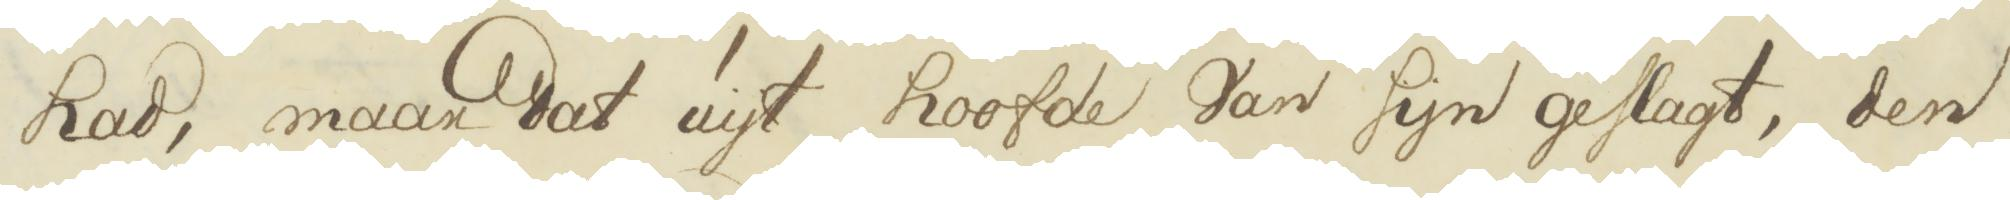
had, maar dat uijt hoofde van sijn geslagt, den
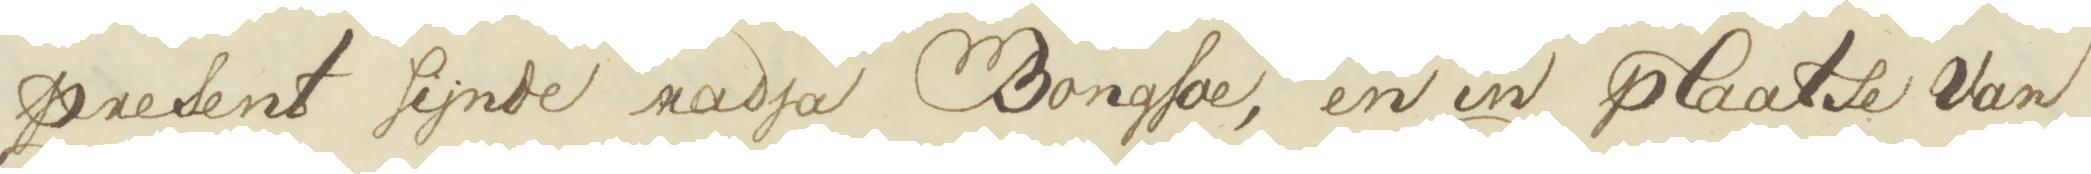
present sijnde radja Bongsoe, en in plaatse van
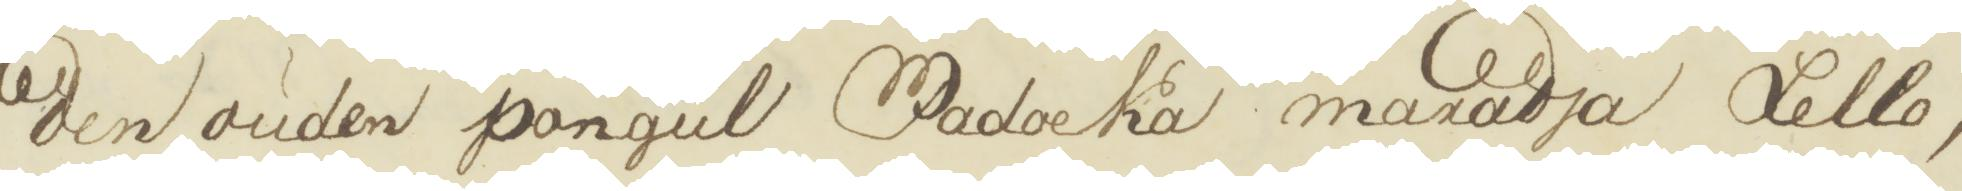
den ouden pongul Padoeka maradja Lello
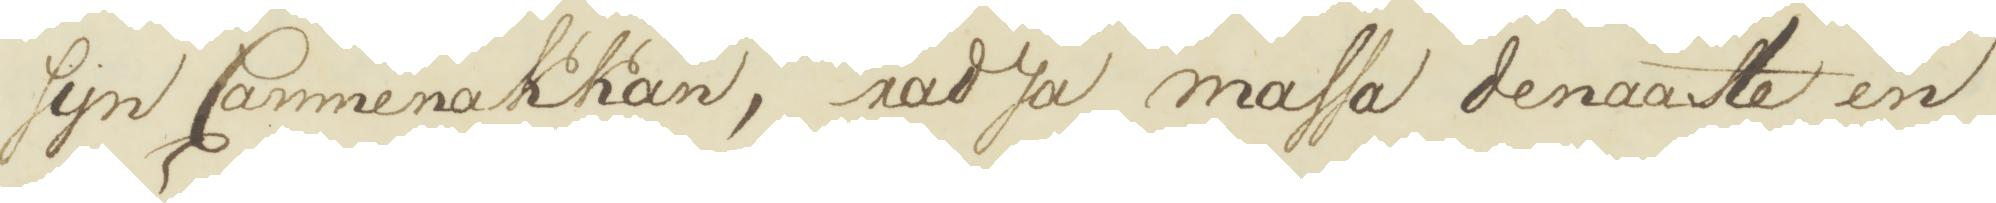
sijn Canmenakkan, radja massa denaaste en
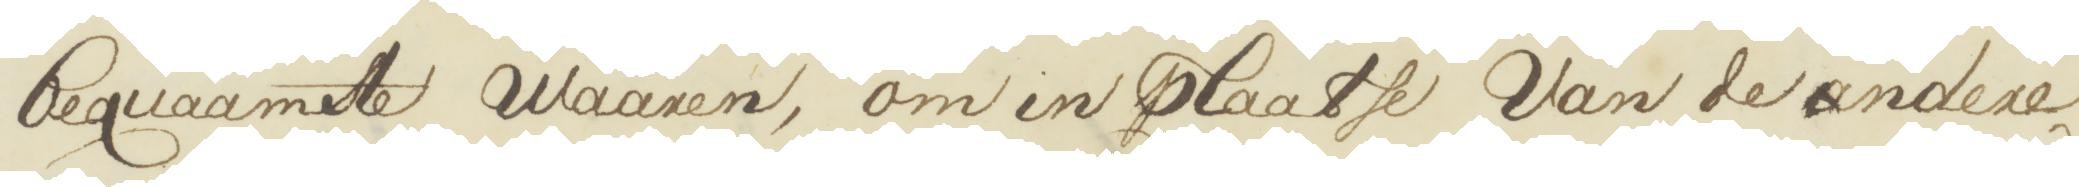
bequaamste waaren, om in plaatse van de andere
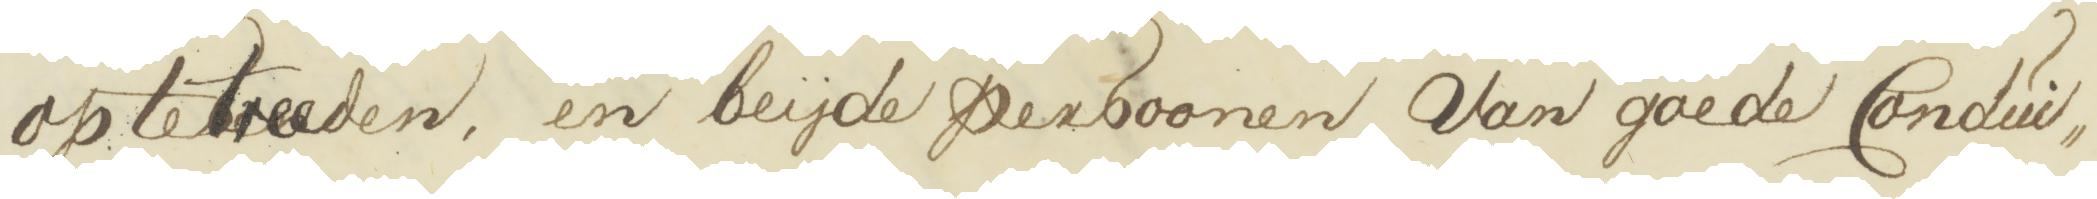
op te treeden, en beijde persoonen van goede Condui„
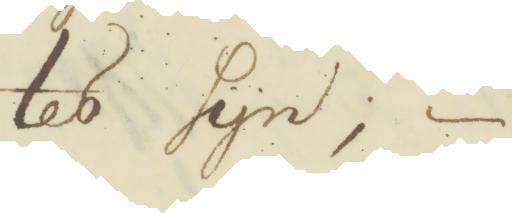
tes sijn; —.
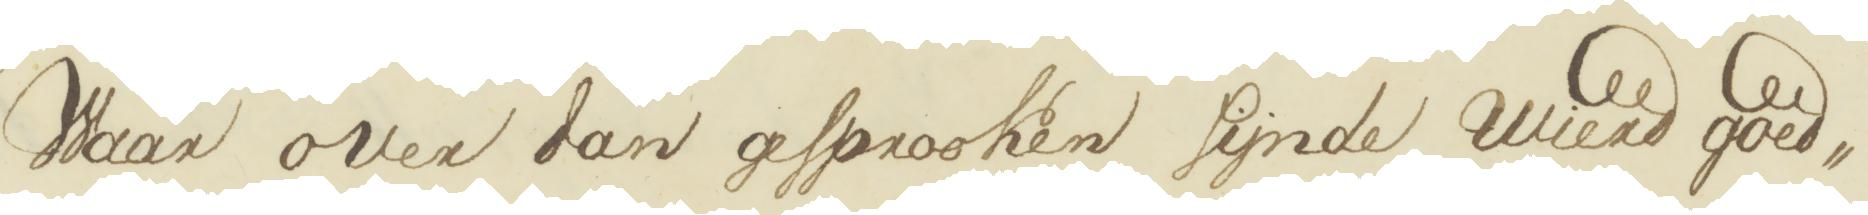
Waar over dan gesprooken sijnde wierd goed„
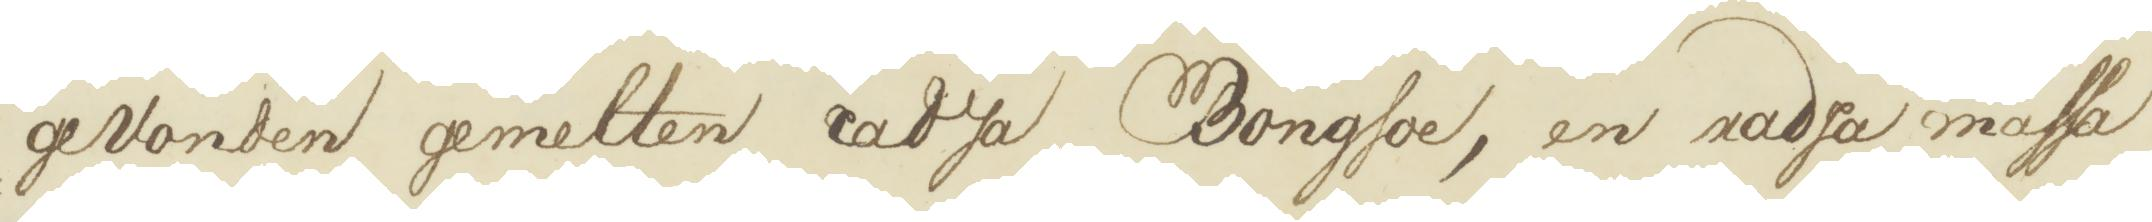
gevonden gemelten radja Bongsoe, en radja massa
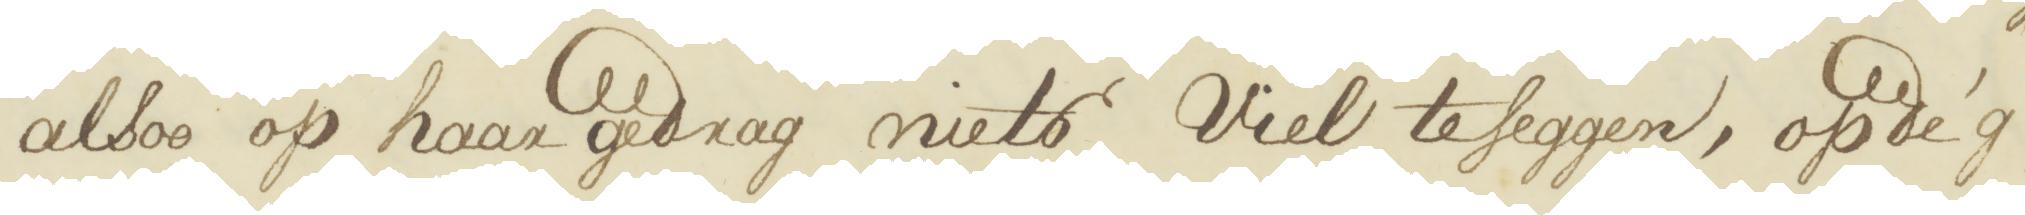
alsoo op haar gedrag niets viel teseggen, op de’ g’
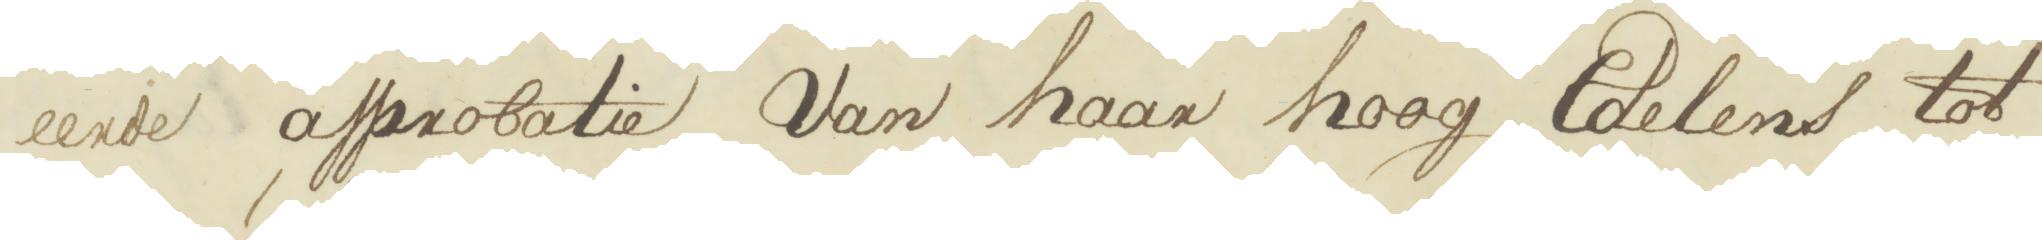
eerde approbatie van haar hoog Edelens tot
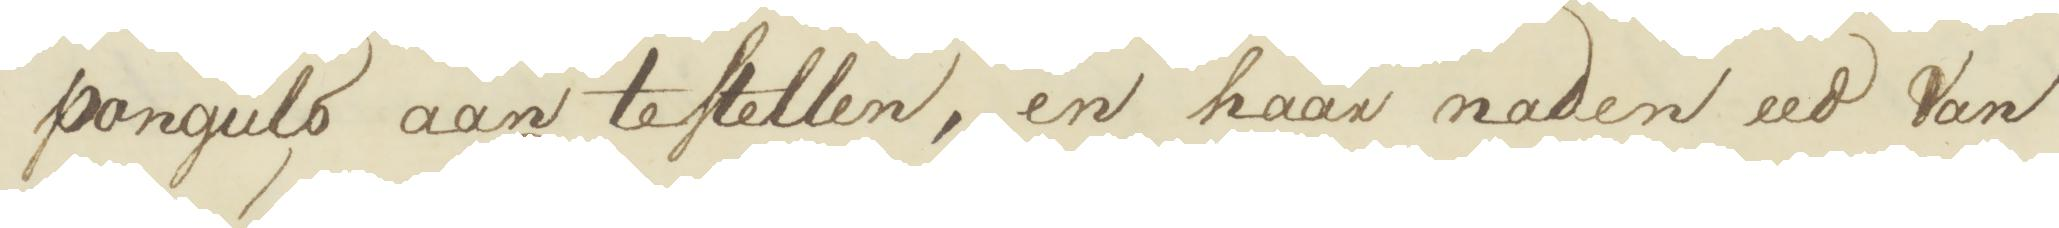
ponguls aan te stellen, en haar naden eed van
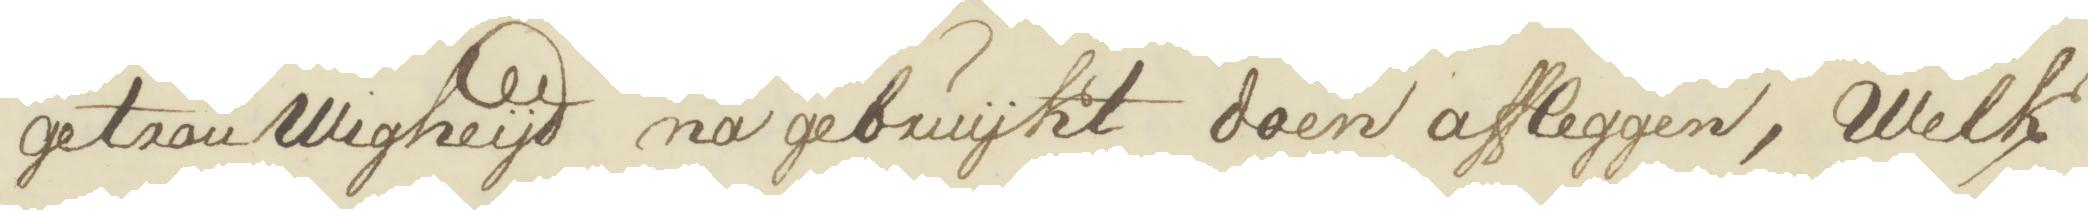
getrouwigheijd na gebuijkt doen affleggen, welk
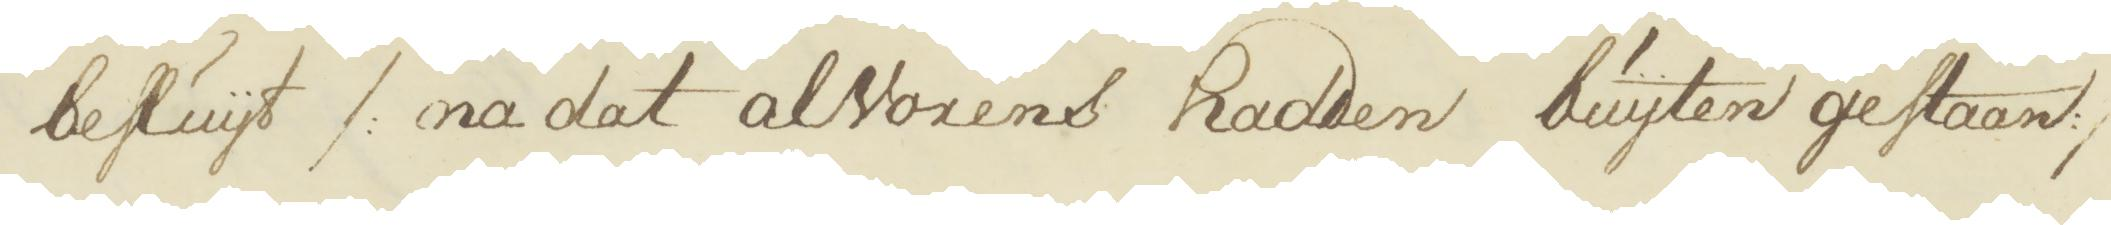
besluijt /: na dat alvorens hadden buijten gestaan:/
